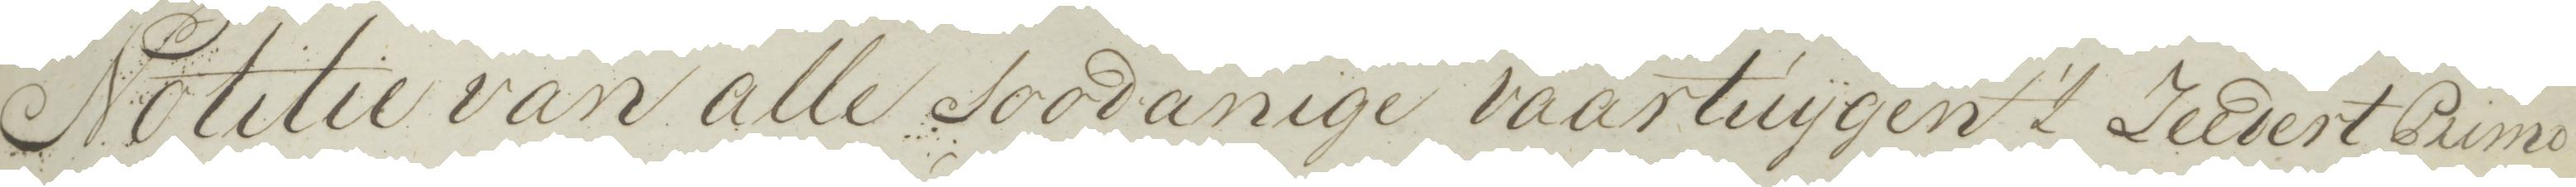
Notitie van alle soodanige vaartuijgen ’t zeedert Primo
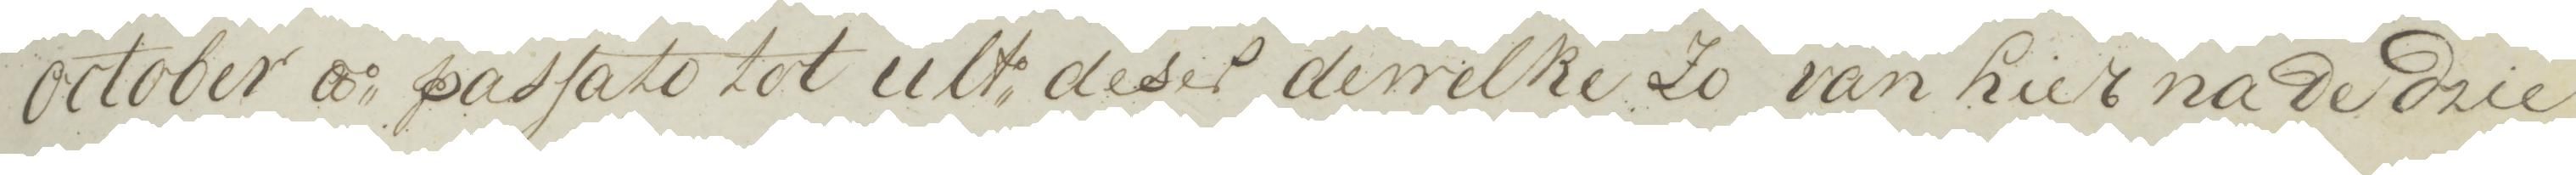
October a„o passato tot ult„o deses dewelke zo van hier na de drie
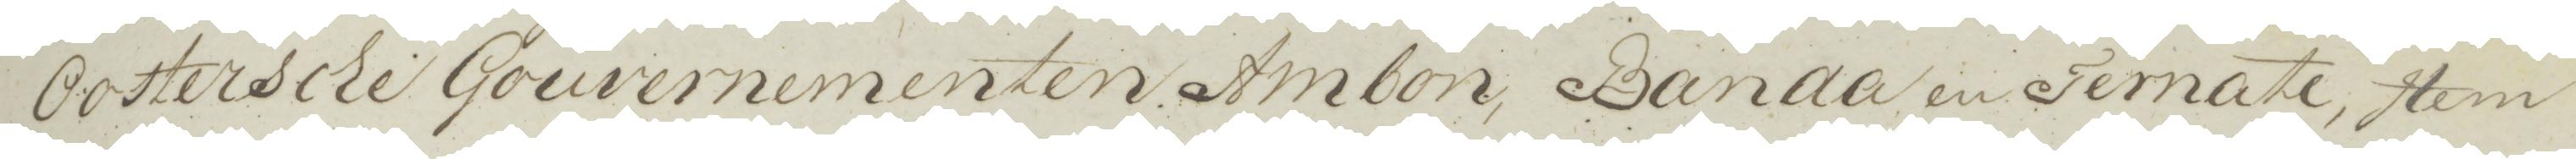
Oostersche Gouvernementen Ambon, Banda en Ternate, Jtem
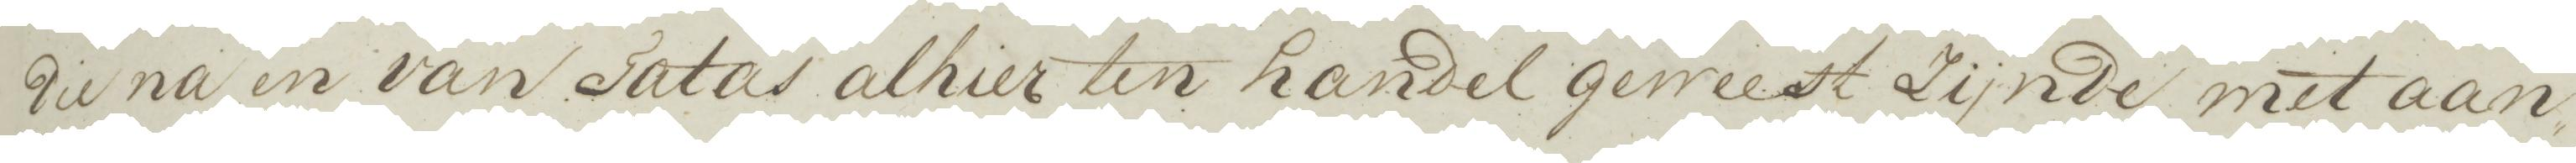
die na en van Tatas alhier ten handel geweest zijnde met aan„
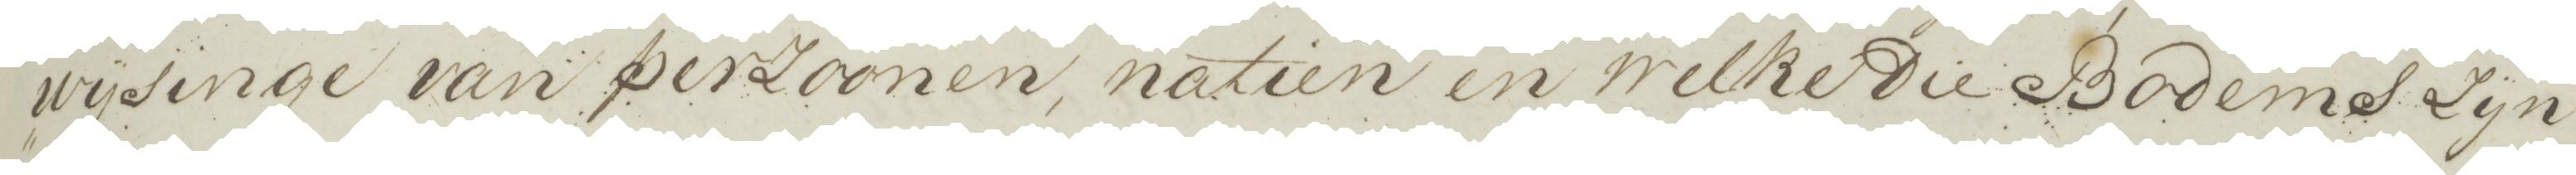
„wijsinge van perzoonen, natien en welke die Bodems zijn
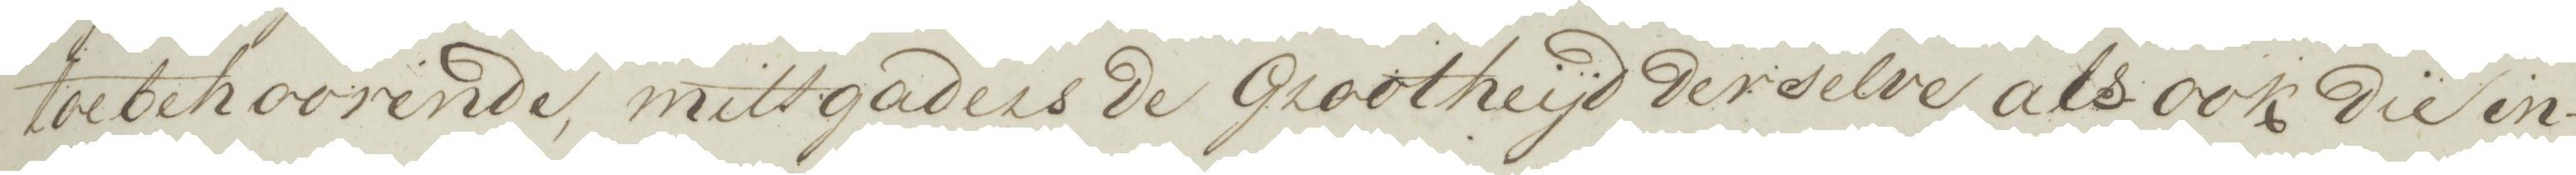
toebehoorende, mitsgaders de grootheijd derselve als ook die in
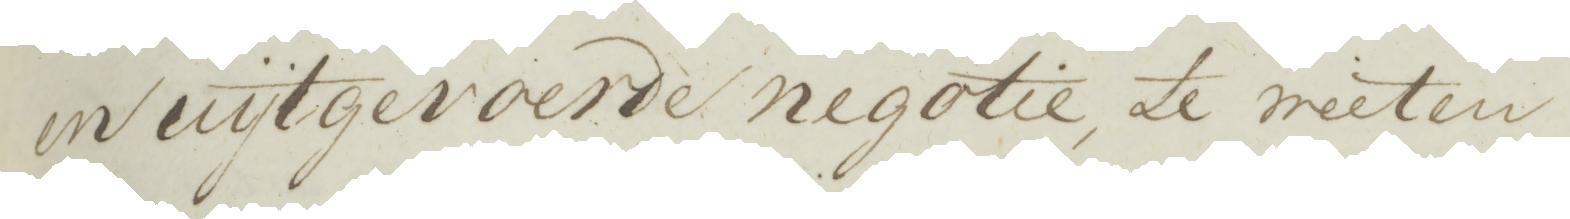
in uijtgevoerde negotie, te weeten
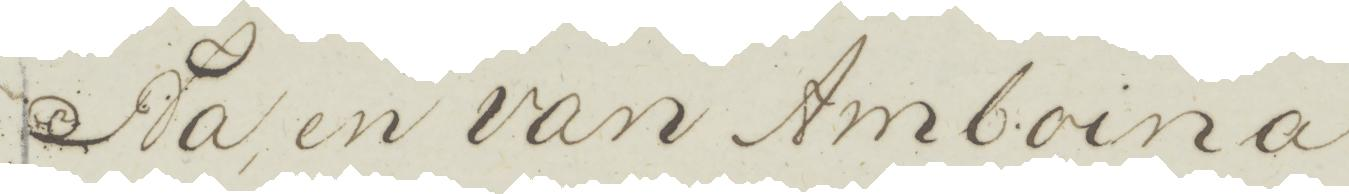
Na, en van Amboina
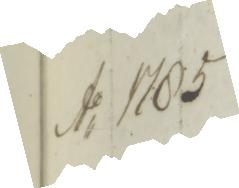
A„o 1765
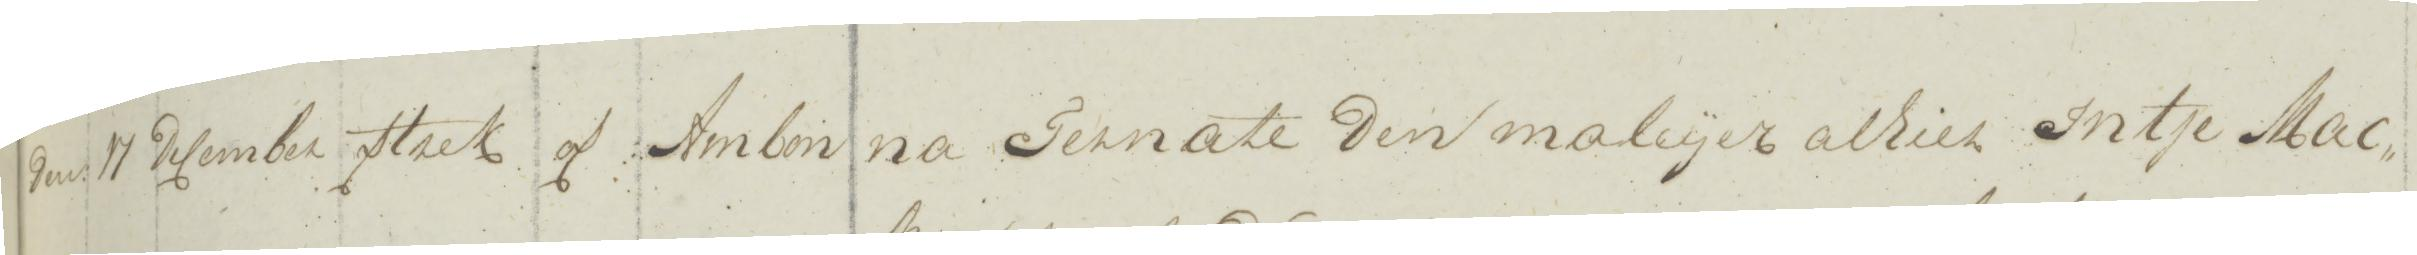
den 17 december vertrek over Amboin na Ternate den maleijer alhier Intje Mac„
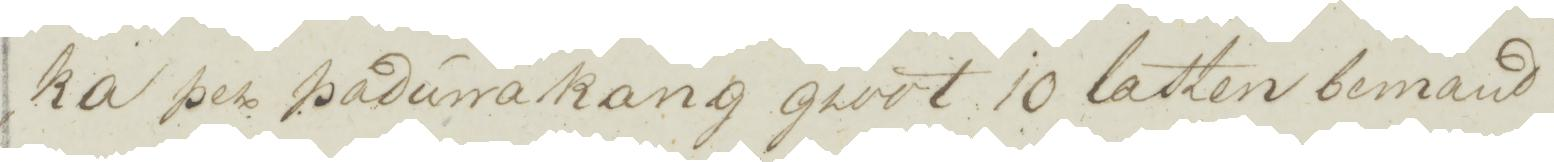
ka per paduwakang groot 10 lasten bemand
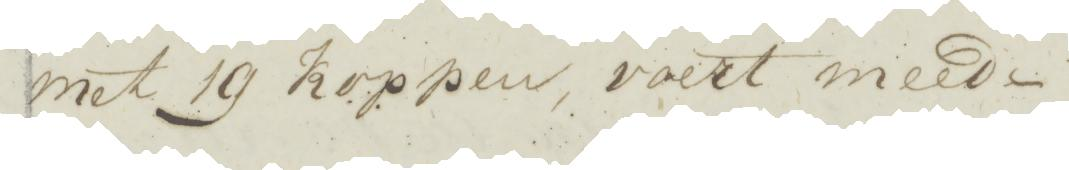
met 19 koppen, voert meede
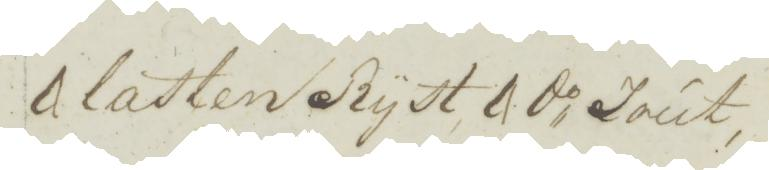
4 lasten Rijst, 4: d„o zout,
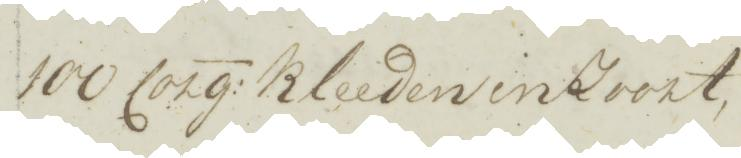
100 Corg: kleeden in zoort,
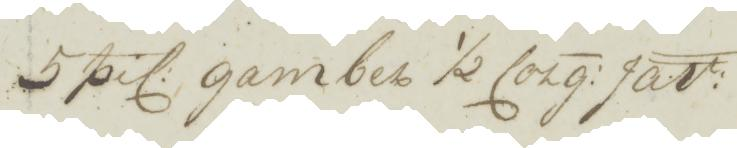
5 pic: gamber ½ Corg: Jav:
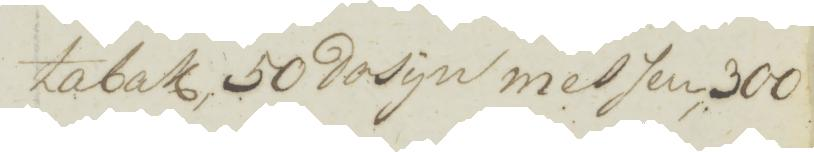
tabak, 50 dosijn messen, 300
